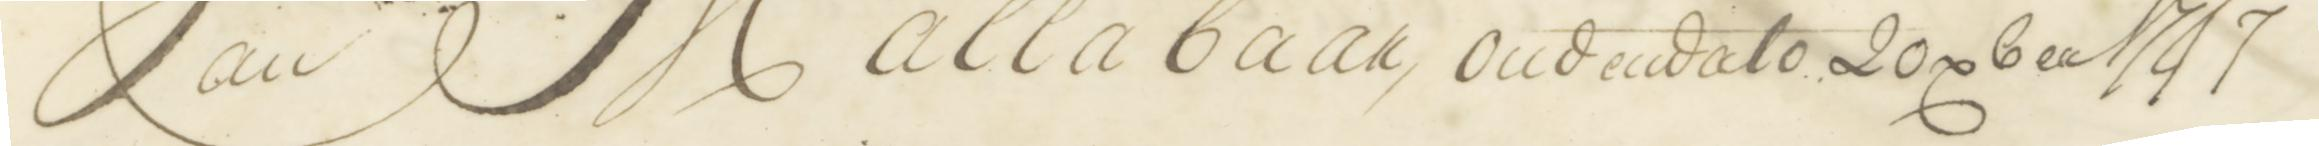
Van Mallabaar, onder dato 20 xber 1747
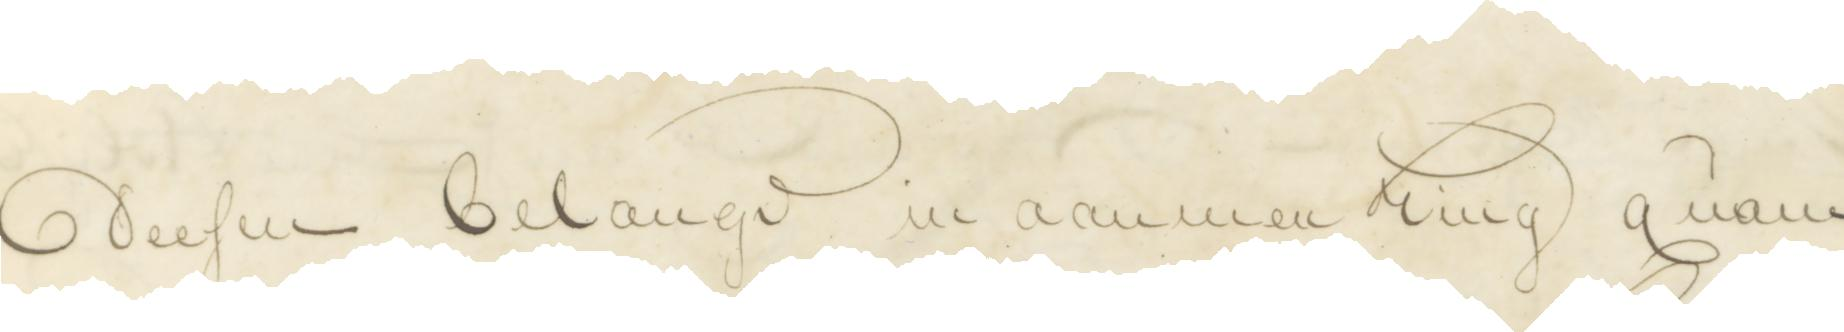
deesen belange in aanmerking quam
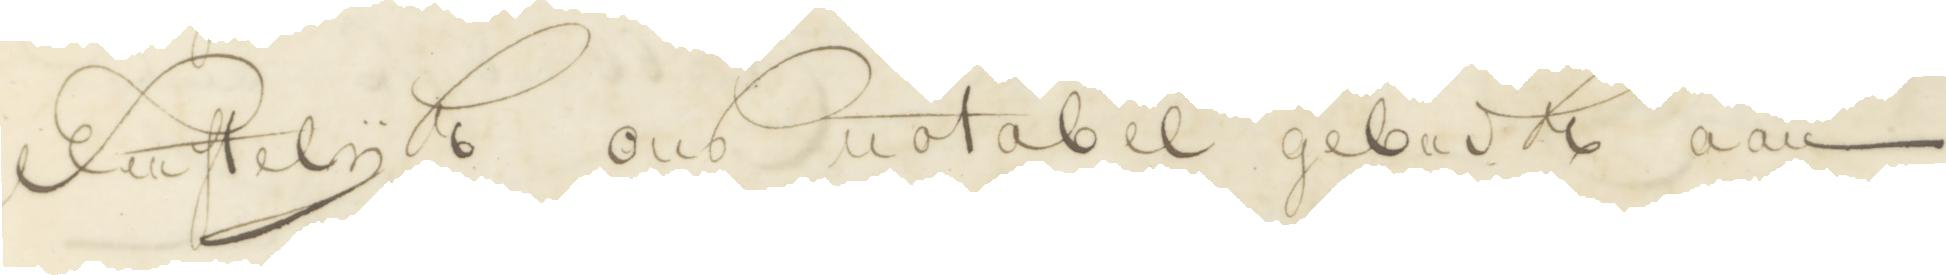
Eerstelijk ons notabel gebrek aan
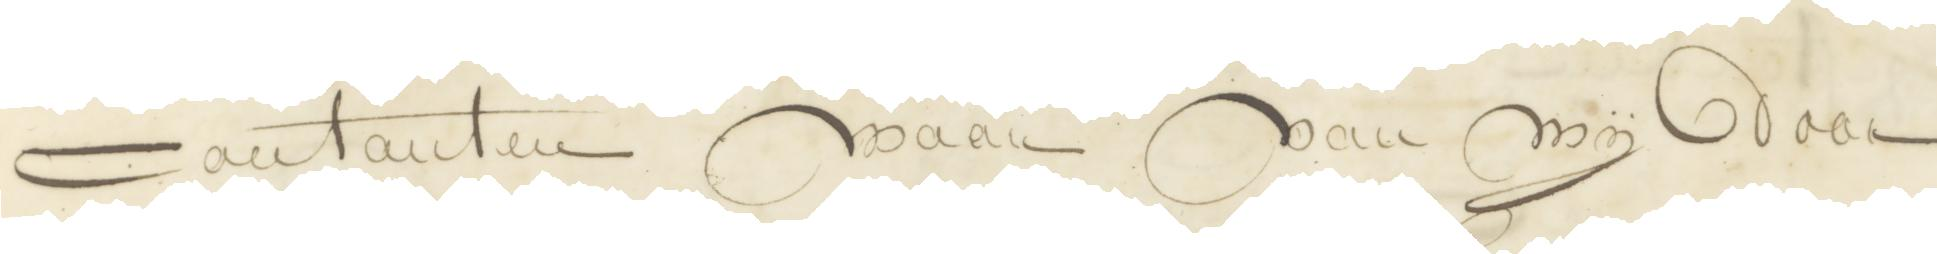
contanten waar van wij door
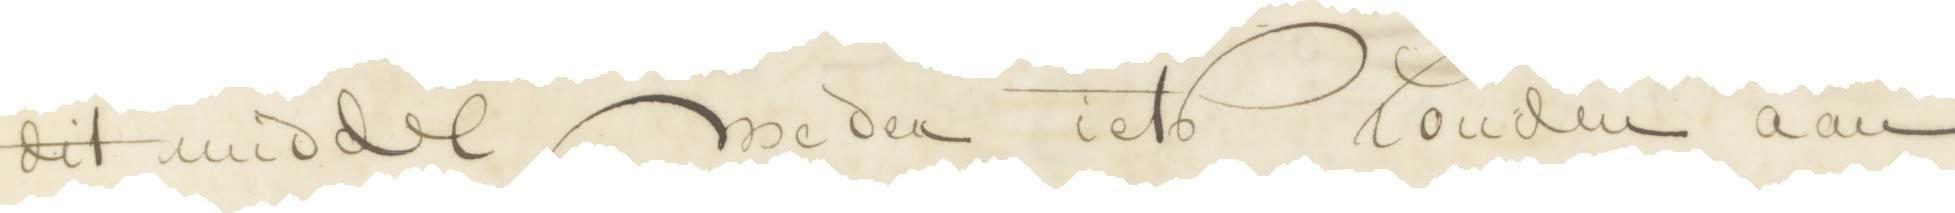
dit middel weder iets konden aan
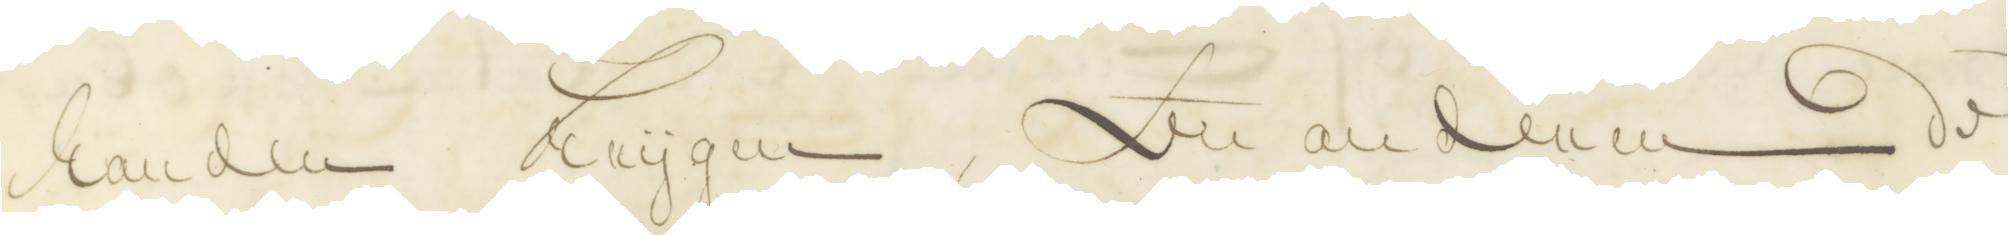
handen krijgen, ten anderen de
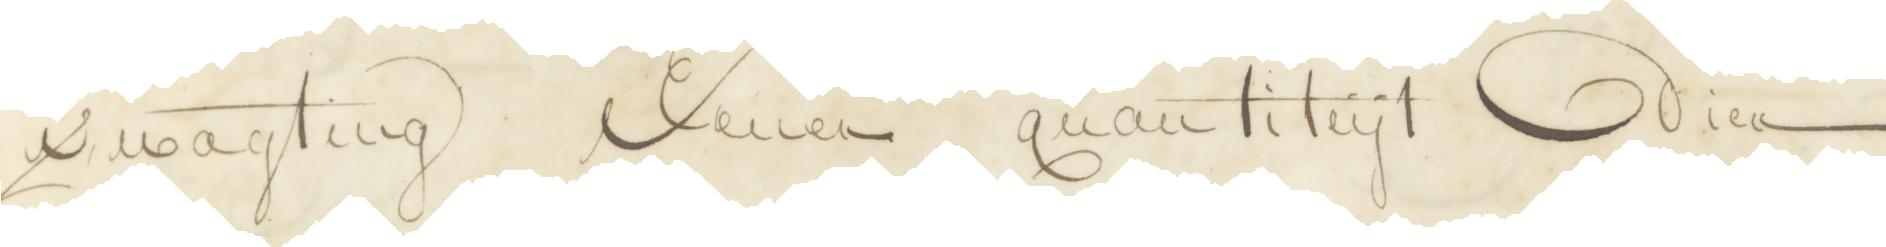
verwagting Eener quantiteijt dier
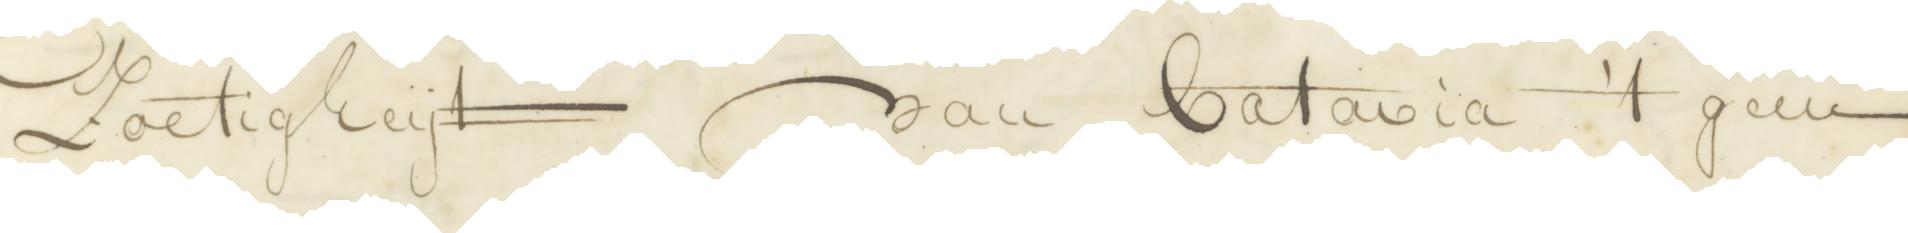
zoetigheijt van batavia ’t geen
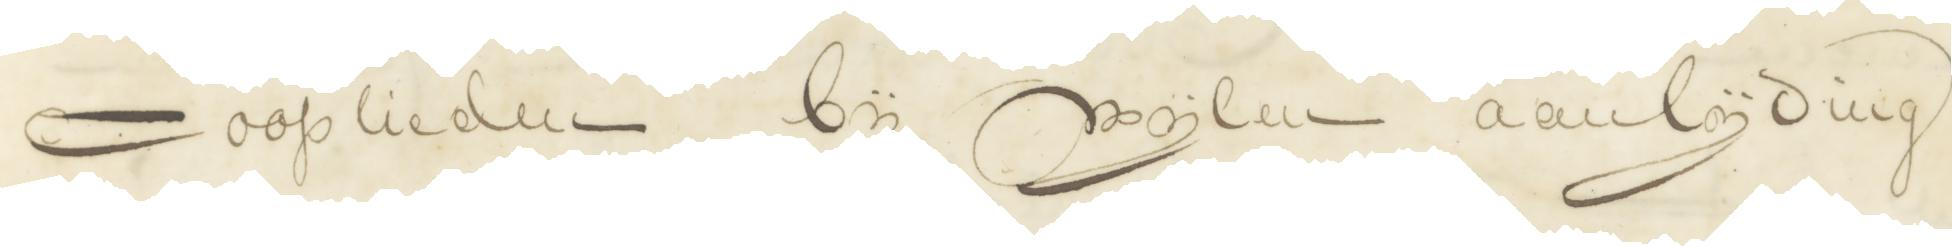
cooplieden bij wijlen aanlijding
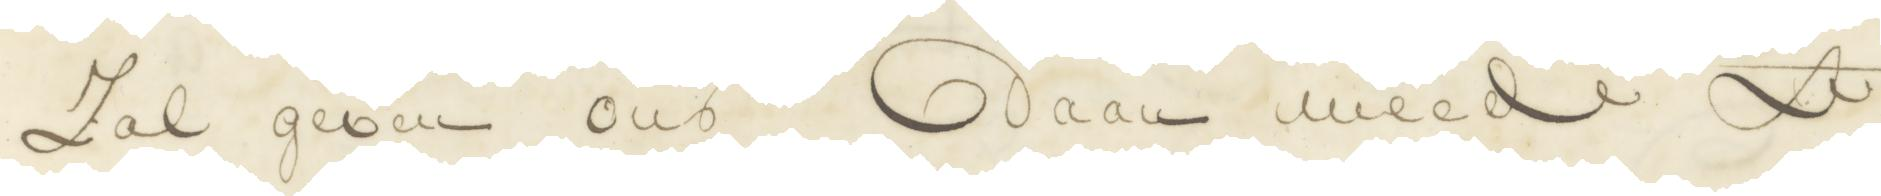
zal geven ons daar meede te
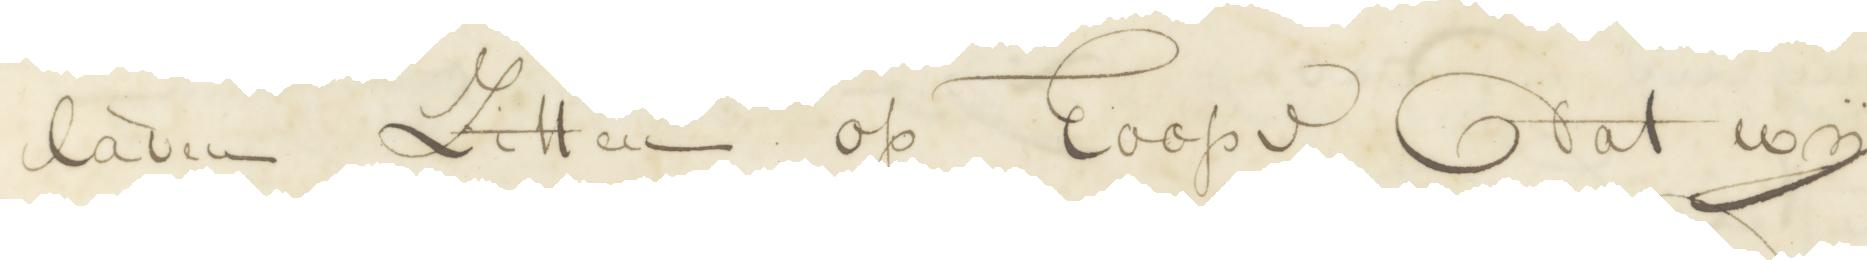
laden zitten op hoope dat wij
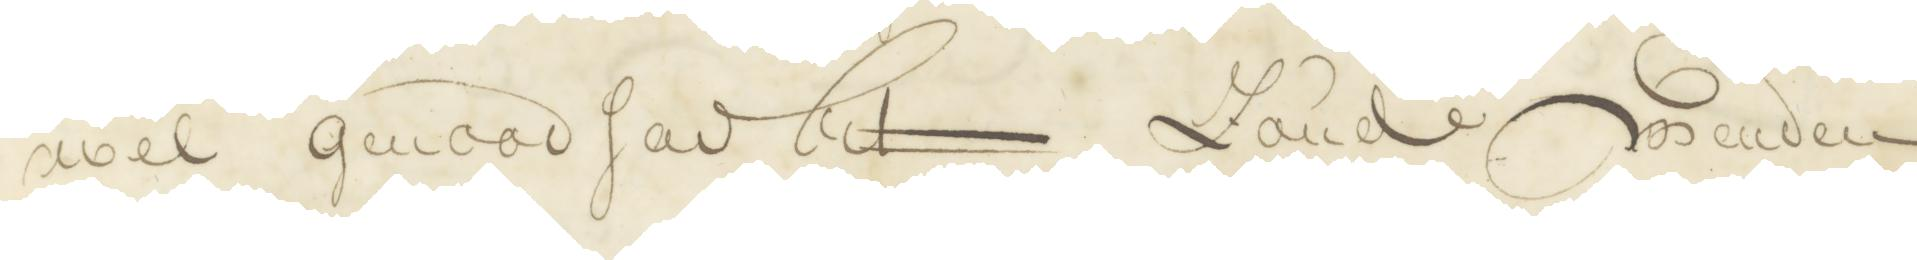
wel genoodsaekt zoude werden
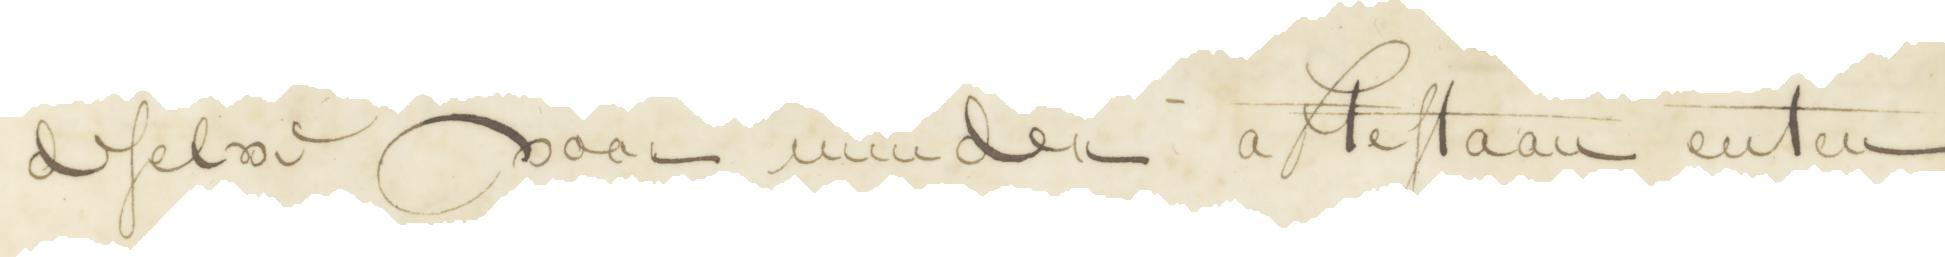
deselve voor minder aftestaan enten
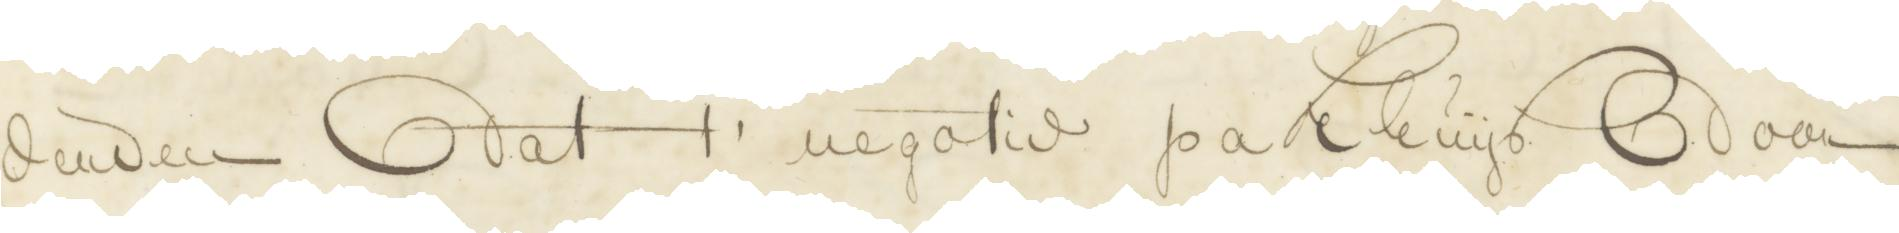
derden dat t' negotie pakhuijs door
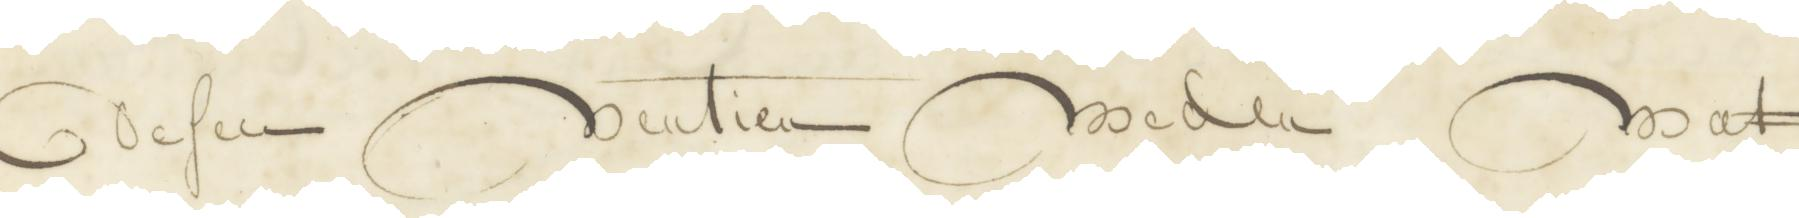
desen vertier weder wat
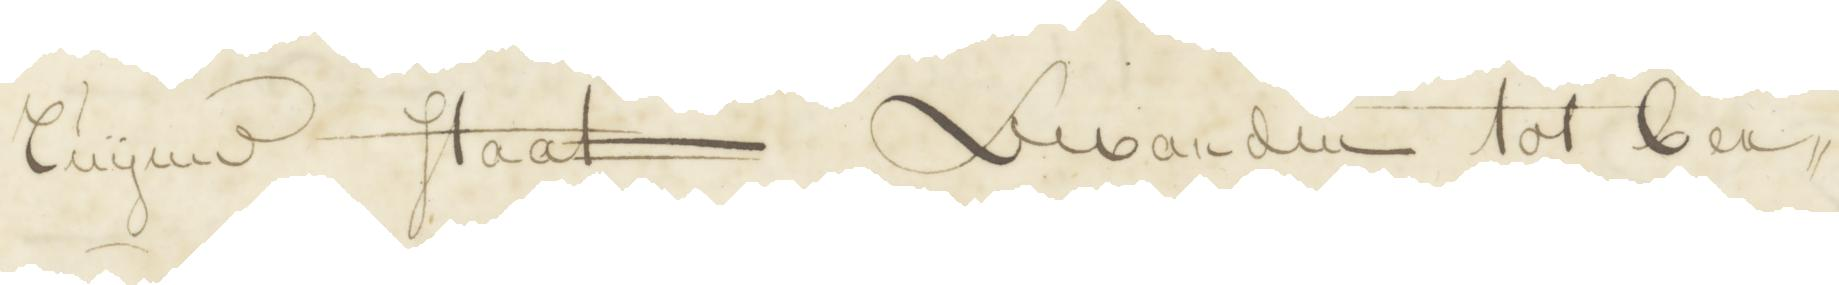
ruijme staat tewarden tot ber„
